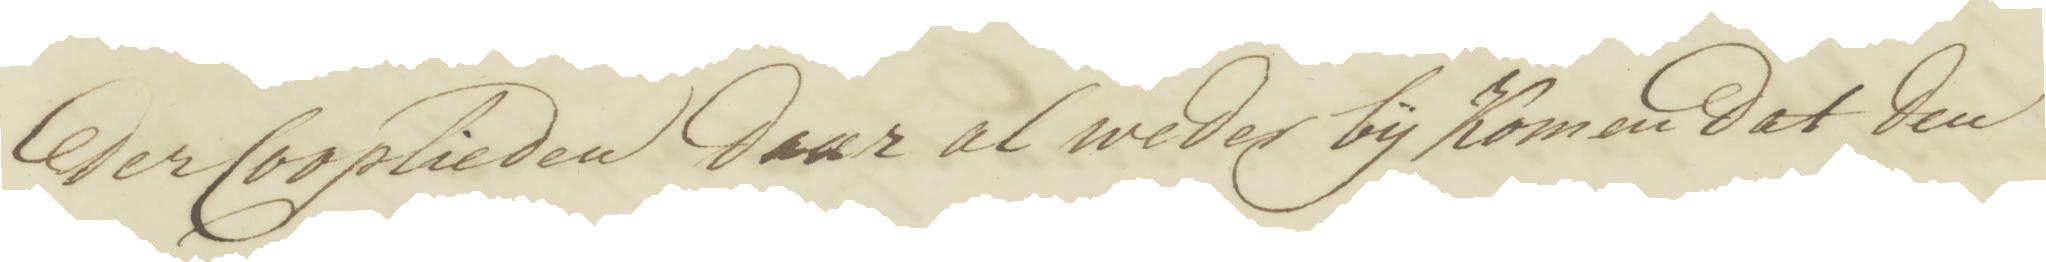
deser cooplieden daar al weder bij Komen dat den
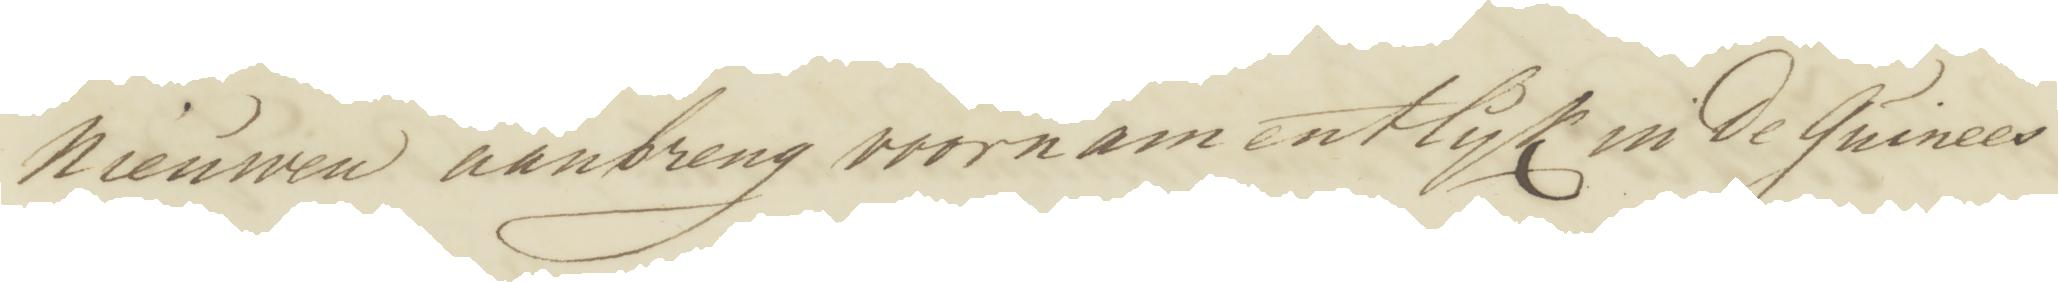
nieuwen aanbreng voornamentlyk in de Guinees
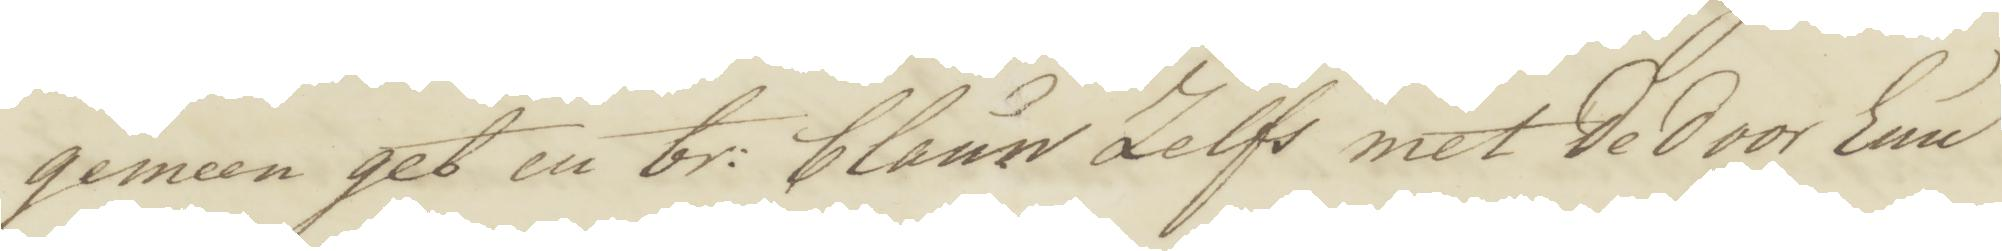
gemeen geb en br: blauw Zelfs met de door hun
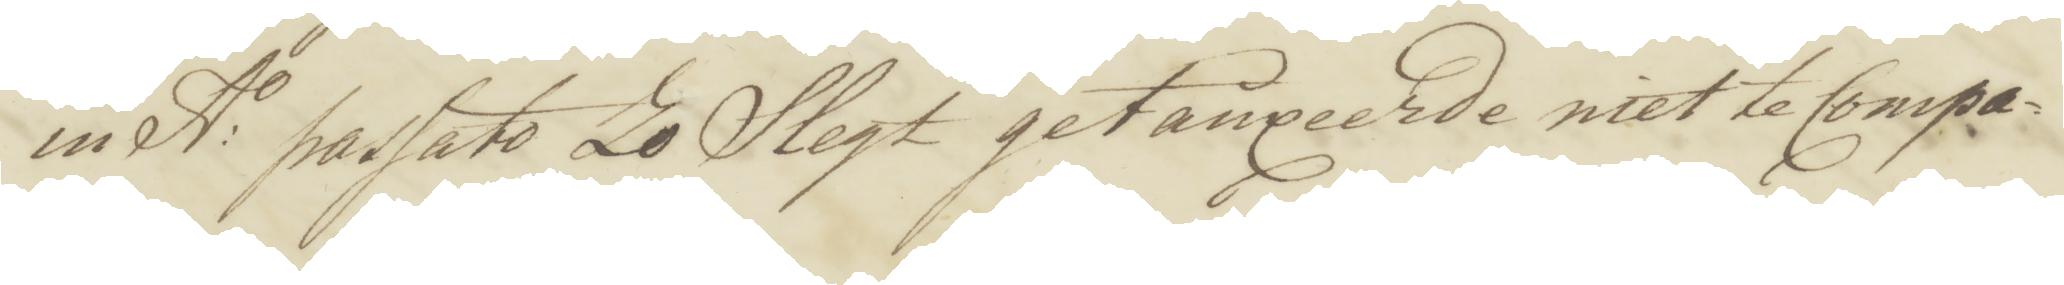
in A:o passato Zo slegt getauxeerde niet te Compa
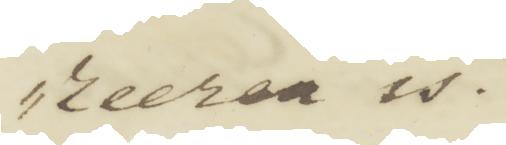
„reeren is.
